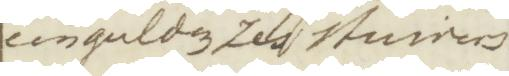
een gulden zes stuivers
